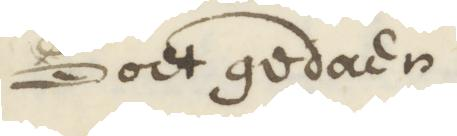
Goet gedaen
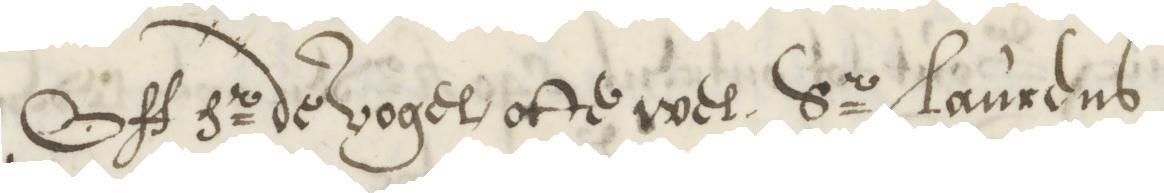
Off s=r de vogel ofte wel. s=r Laurens
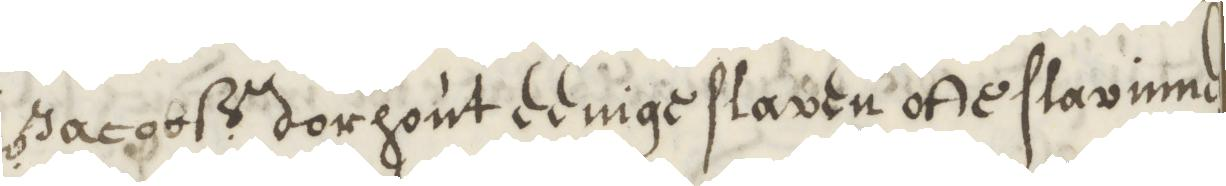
Iacobsz dorhout eenige slaven ofte slavinne
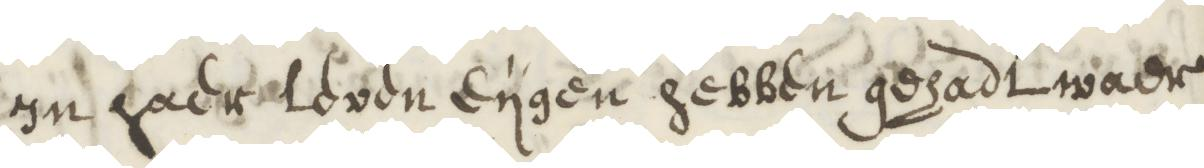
In haer leven eijgen hebben gehadt waer
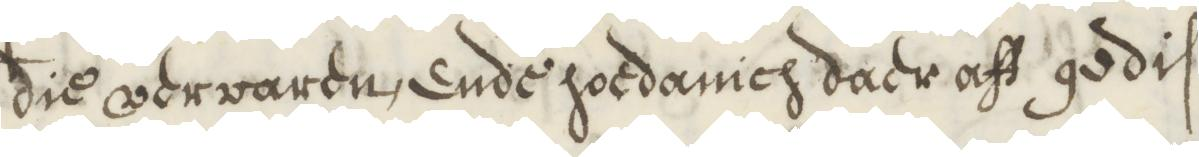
die vervaren, ende hoedanich daer aff gedis
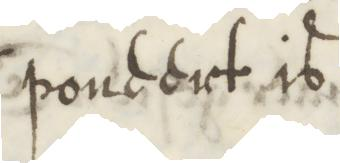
poneert is
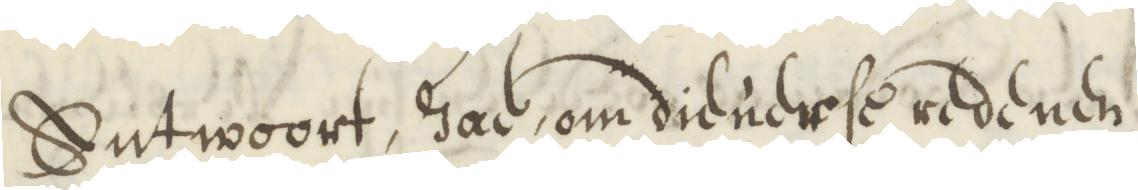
Antwoort, Iae, om dieverse redenen
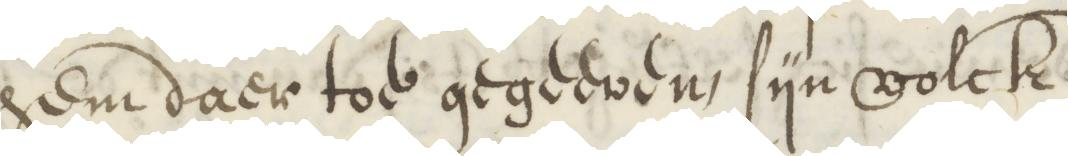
hem daer toe gegeeven, sijn volck
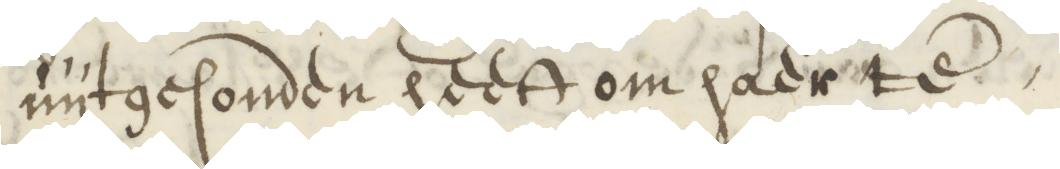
uijtgesonden heeft om haer te,
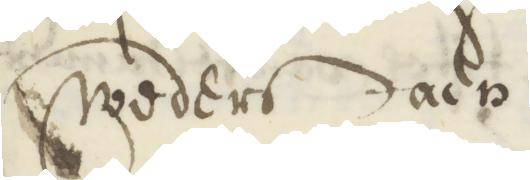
wederstaen
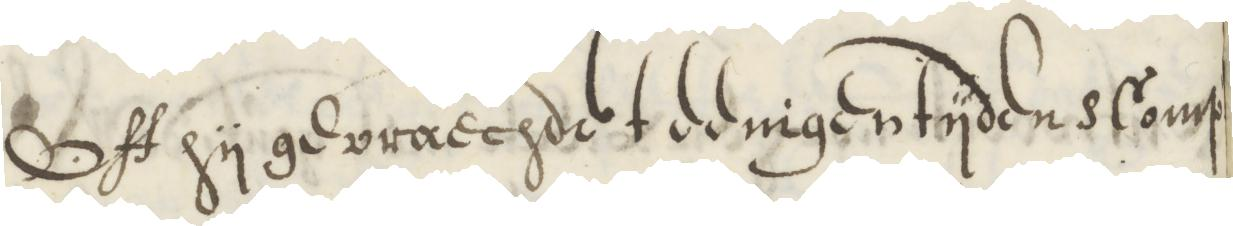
Off hij gevraechde t eenigen tijden s Comp
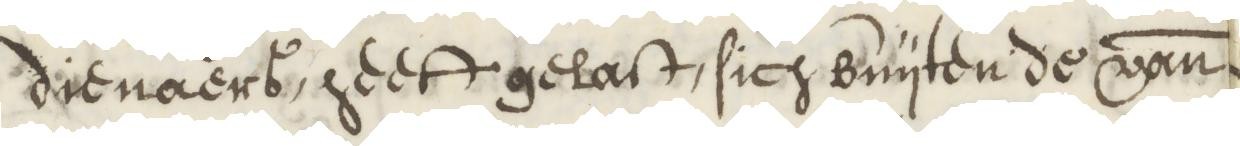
dienaers, heeft gelast, sich buijten de van
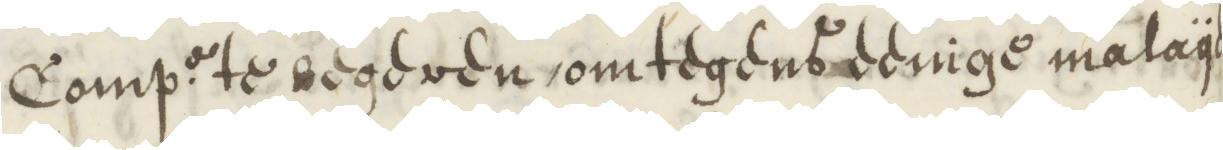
Comp:e te begeven, om tegens eenige malaij
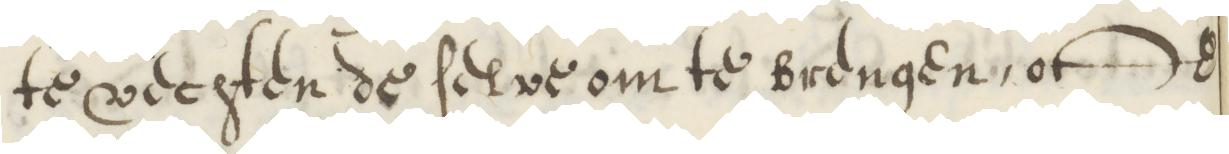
te vechten de selve om te brengen, ofte
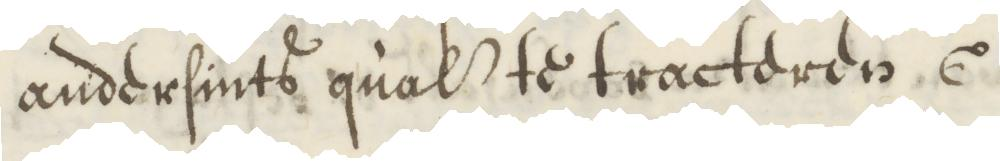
andersints qualijk te tracteren ?
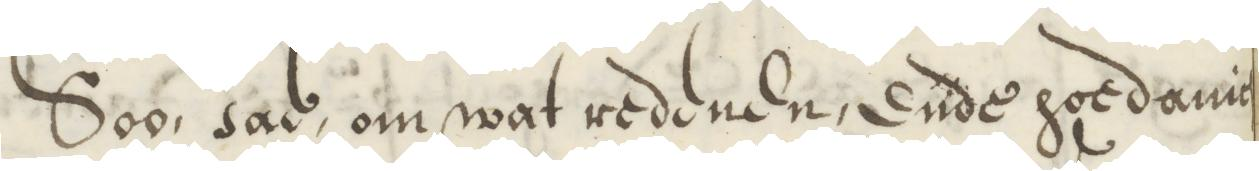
Soo, Iae, om wat redenen, ende hoedanic
